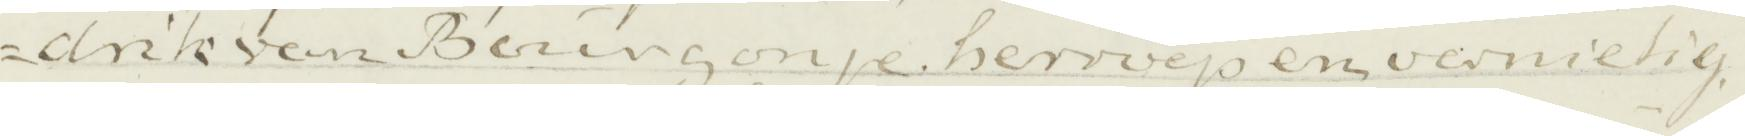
=drik van Bourgonje herroep en vernietig,
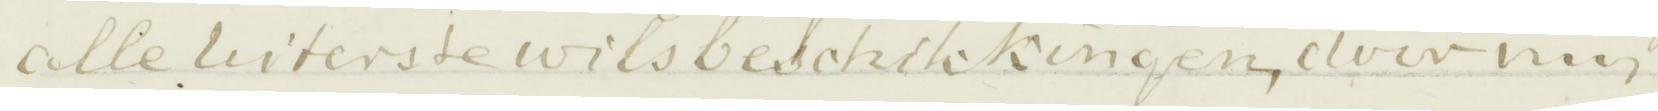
alle uiterste wilsbeschikkingen, door mij
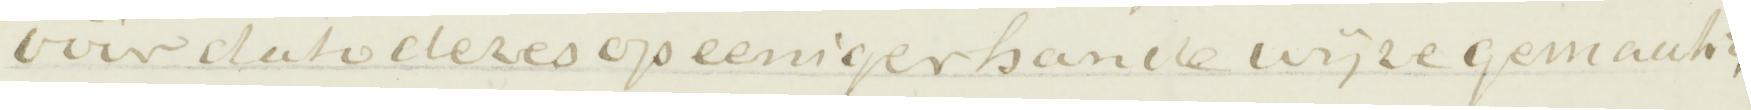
vóór dato dezes op eenigerhande wijze gemaakt
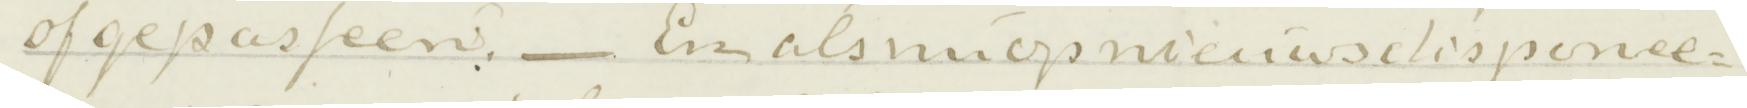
of gepasseerd. — En als nu op nieuws disponee=
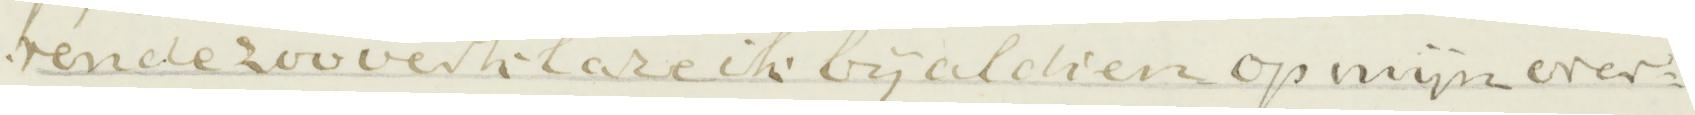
rende zoo verklare ik bij aldien op mijn over=
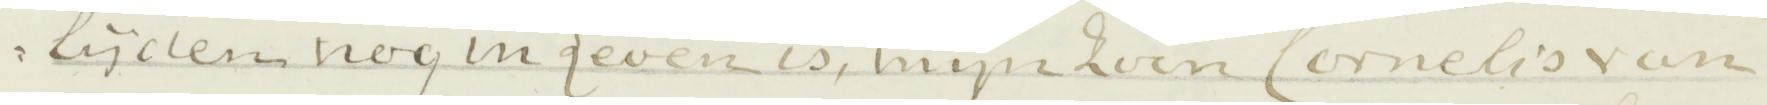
=lijden nog in Leven is, mijn zoon Cornelis van
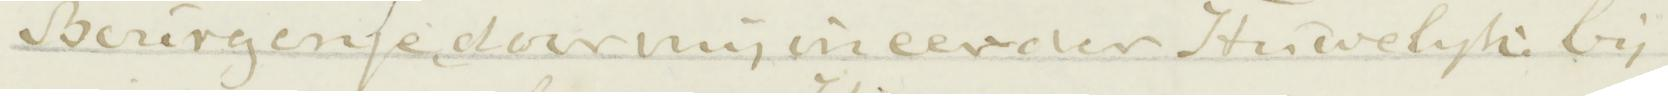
Bourgonje, door mij in eerder Huwelyk bij
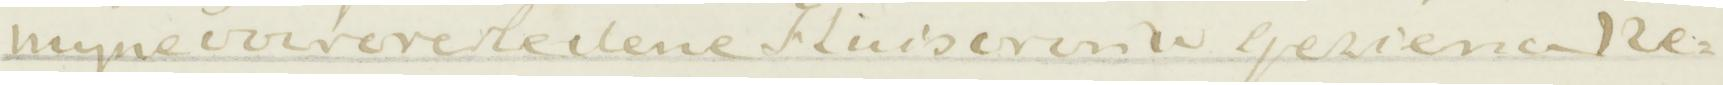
myne vooroverledene Huisvrouw Geziena Ne=
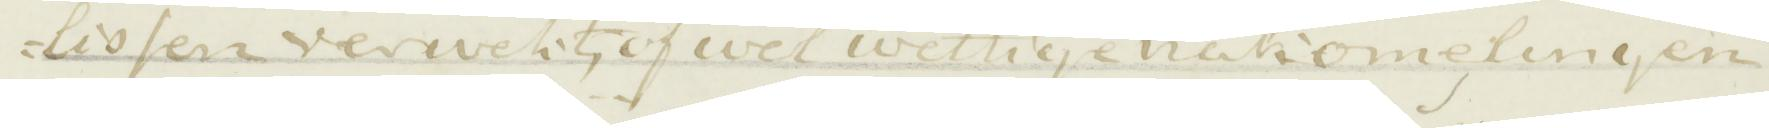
=lissen verwekt, of wel wettige nakomelingen
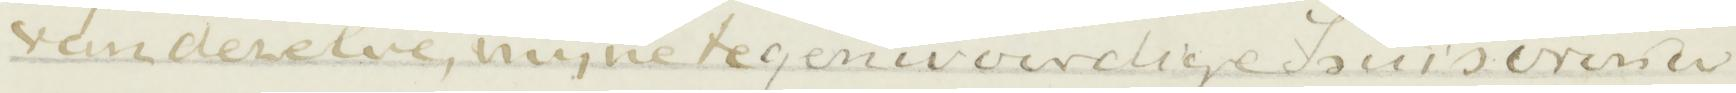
van dezelve, mijne tegenwoordige huisvrouw
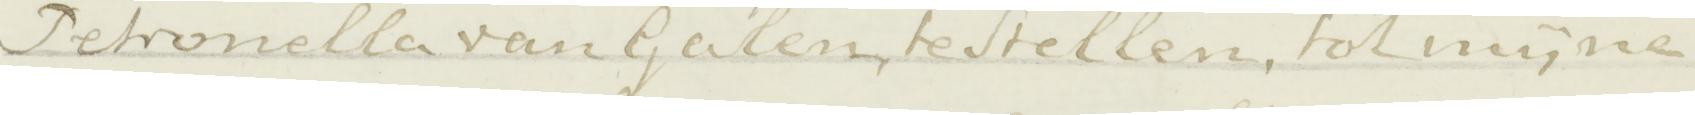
Petronella van Galen, te stellen, tot mijne
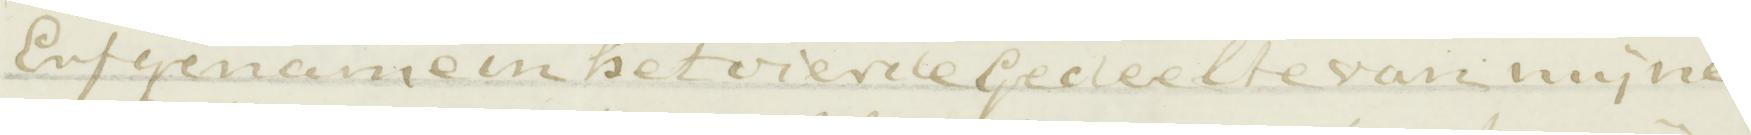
Erfgename in het vierde Gedeelte van mijne
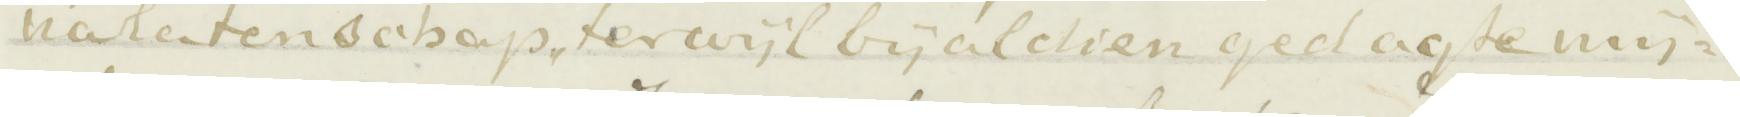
nalatenschap, terwijl bij aldien gedagte mij=
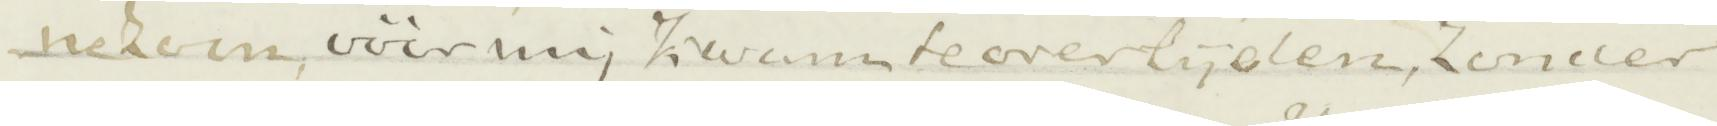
=nezoon, vòòr mij Kwam te overlijden, zonder
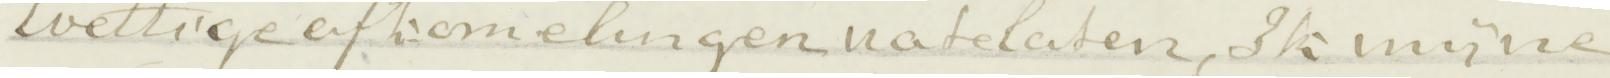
wettige afkomelingen natelaten, Ik mijne
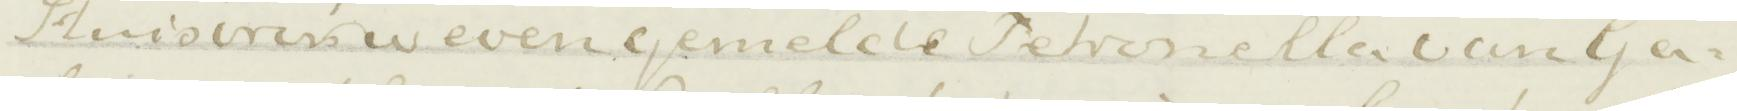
Huisvrouw even gemelde Petronella van Ga=
